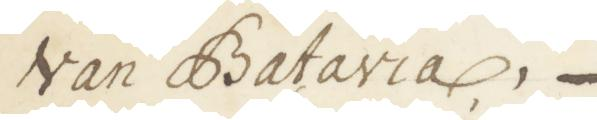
van Batavia.
